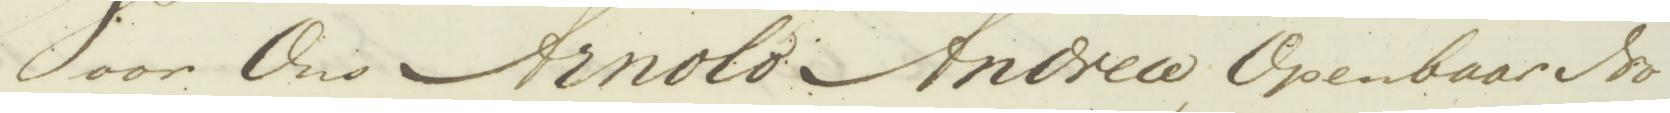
Voor Ons Arnold Andrea, Openbaar No
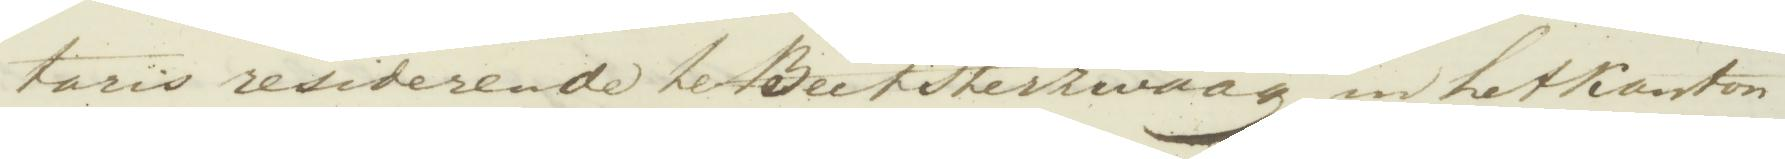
taris residerende te Beetsterzwaag, in het kanton
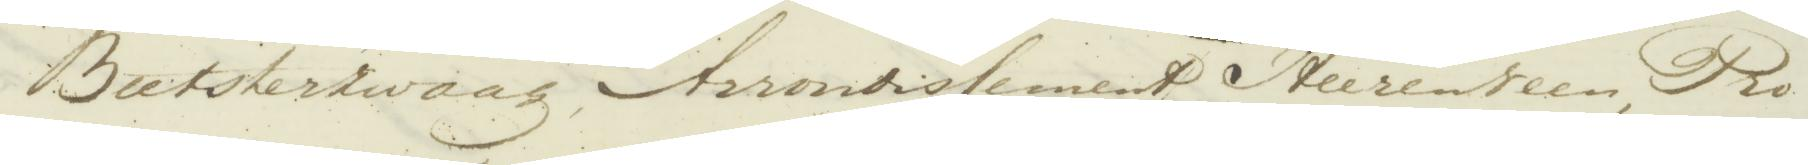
Beetsterzwaag, Arrondissement Heerenveen, Pro
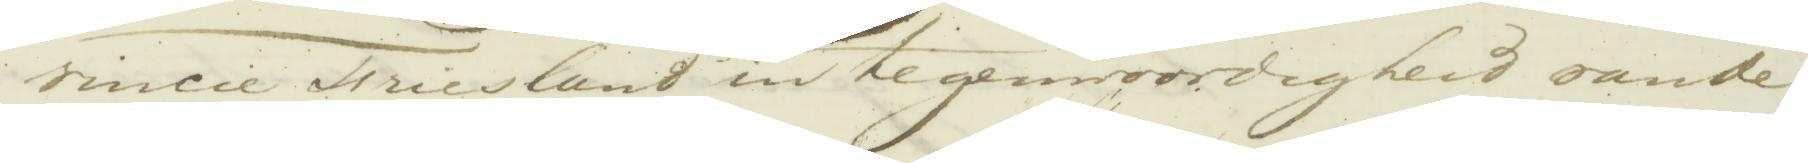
vincie Friesland, in tegenwoordigheid van de
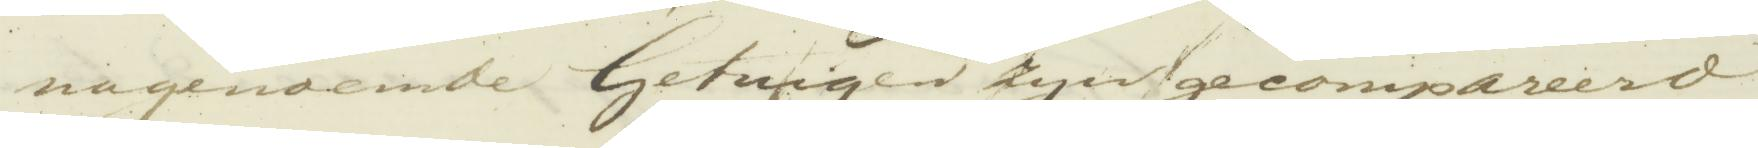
nagenoemde Getuigen zyn gecompareerd
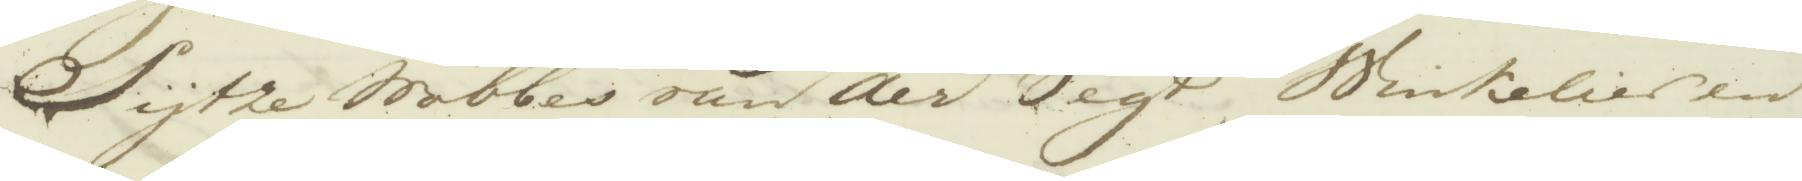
Sijtze Wobbes van der Vegt, Winkelier en
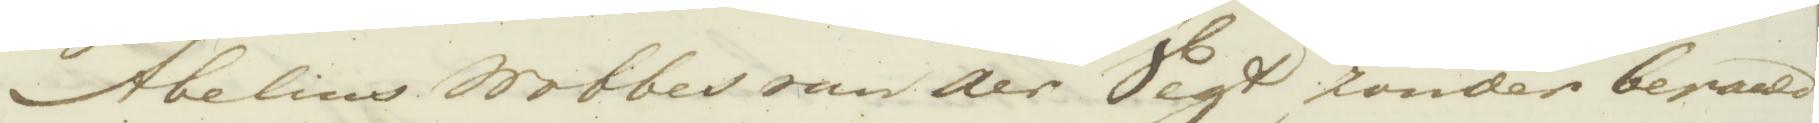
Abelius Wobbes van der Vegt, zonder bepaald
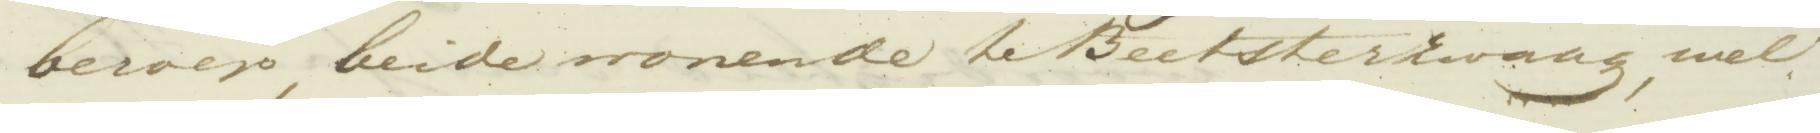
beroep, beide wonende te Beetsterzwaag, wel,
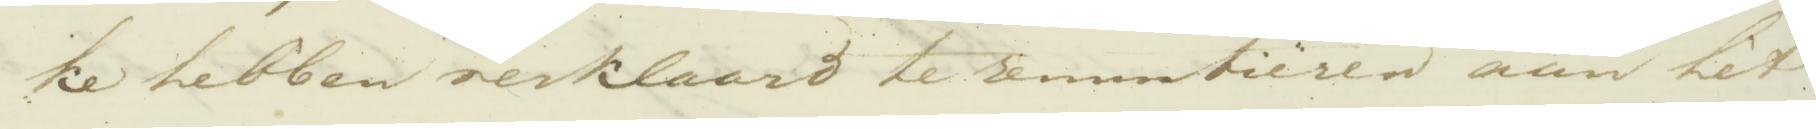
ke hebben verklaard te renuntiëren aan het
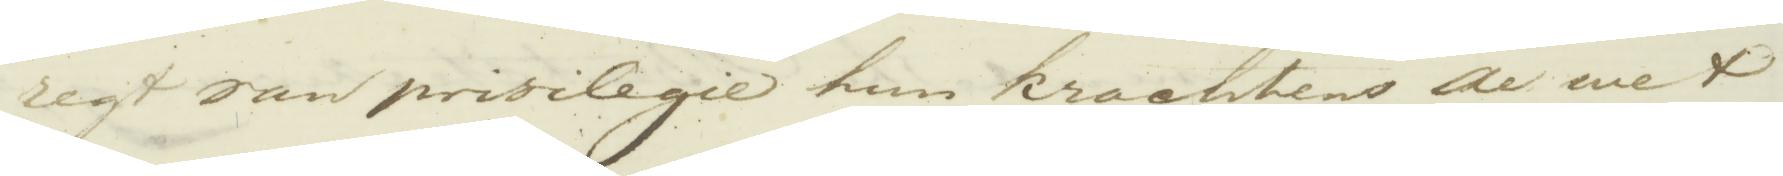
regt van privilegie hun krachtens de wet
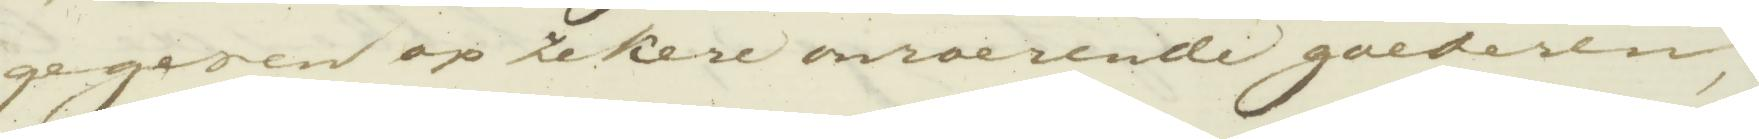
gegeven op zekere onroerende goederen,
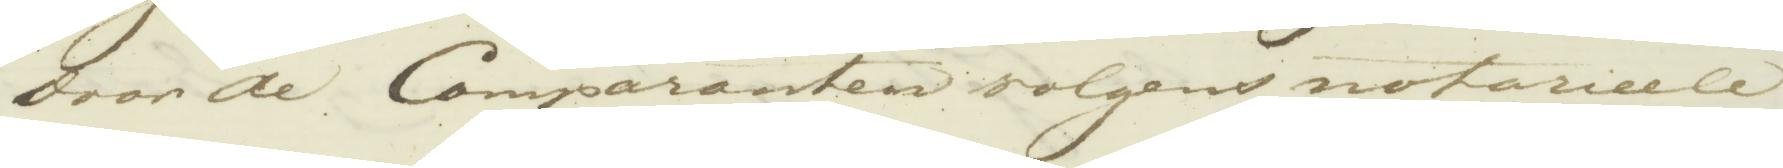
door de Comparanten volgens notarieele
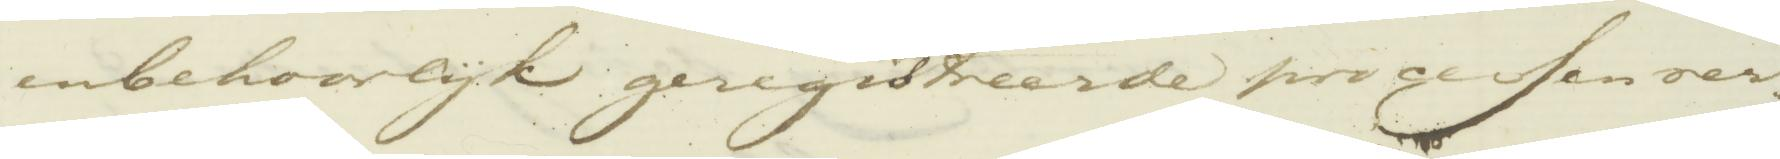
en behoorlijk geregistreerde processen ver„
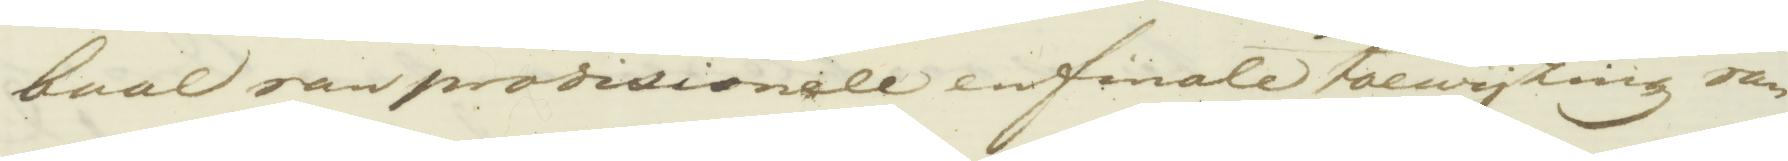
baal van provisionele en finale toewijzing van
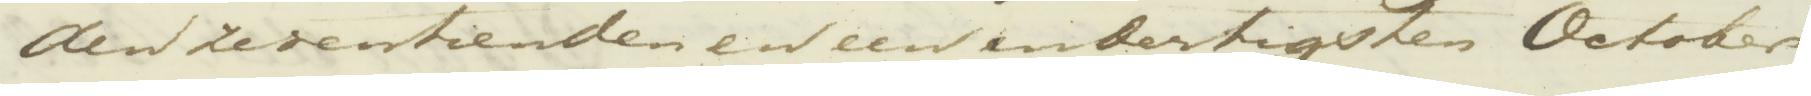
den zeventienden en een en dertigsten October
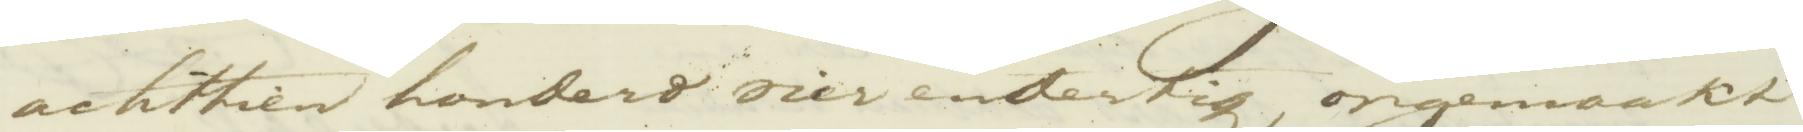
achttien honderd vier en dertig opgemaakt
